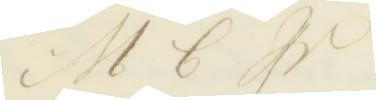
M C W
